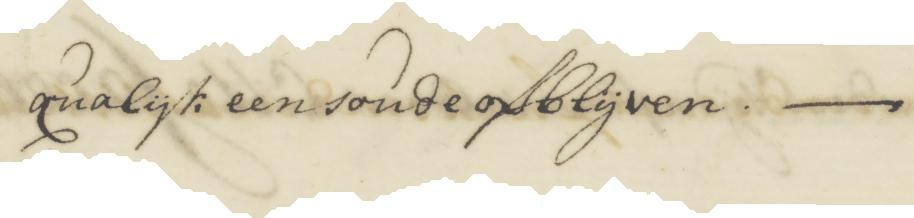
qualijk een soude overblijven. —
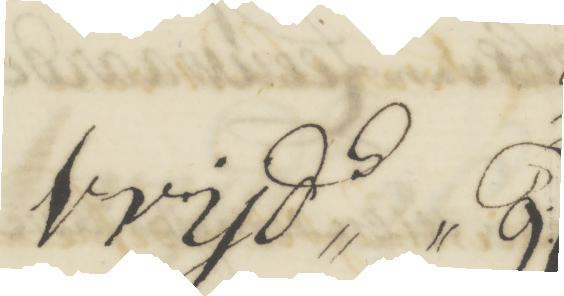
Vrijd„h „ 9:
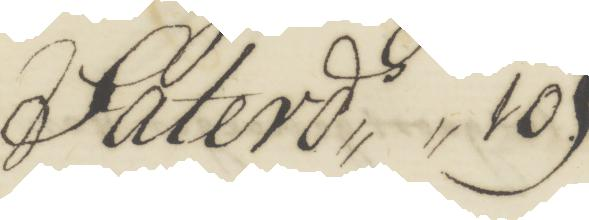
Saterd„h „ 10
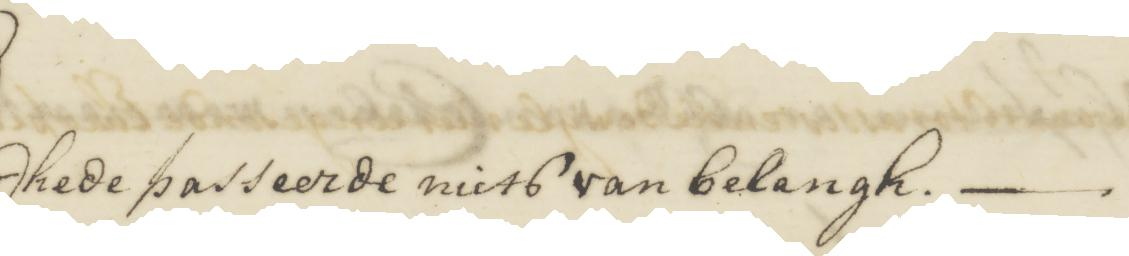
hede passeerde niets van belangh. —
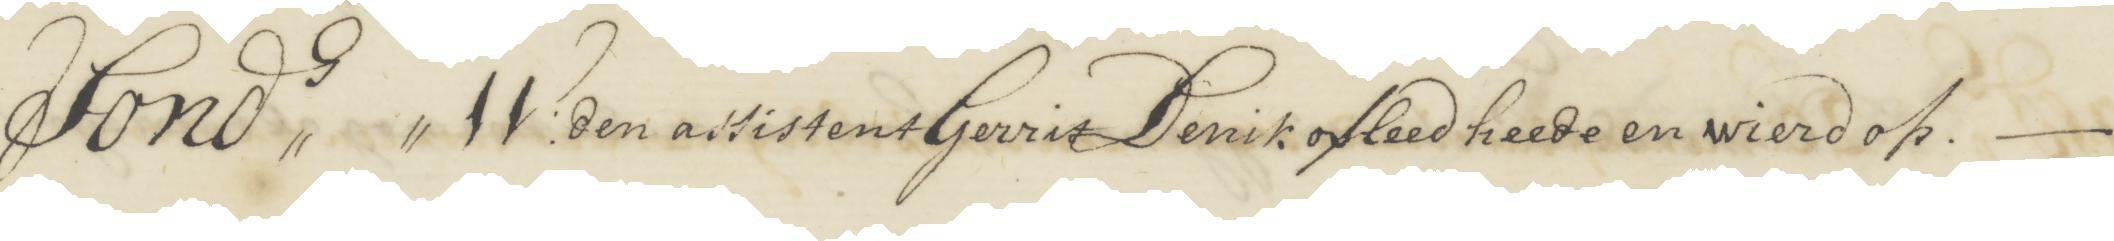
Sond„h „ 11:' den assistent Gerrit Denik overleed heede en wierd op. —
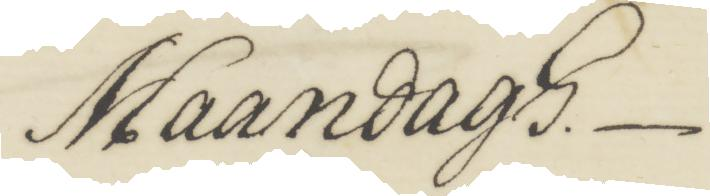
Maandagh. —
